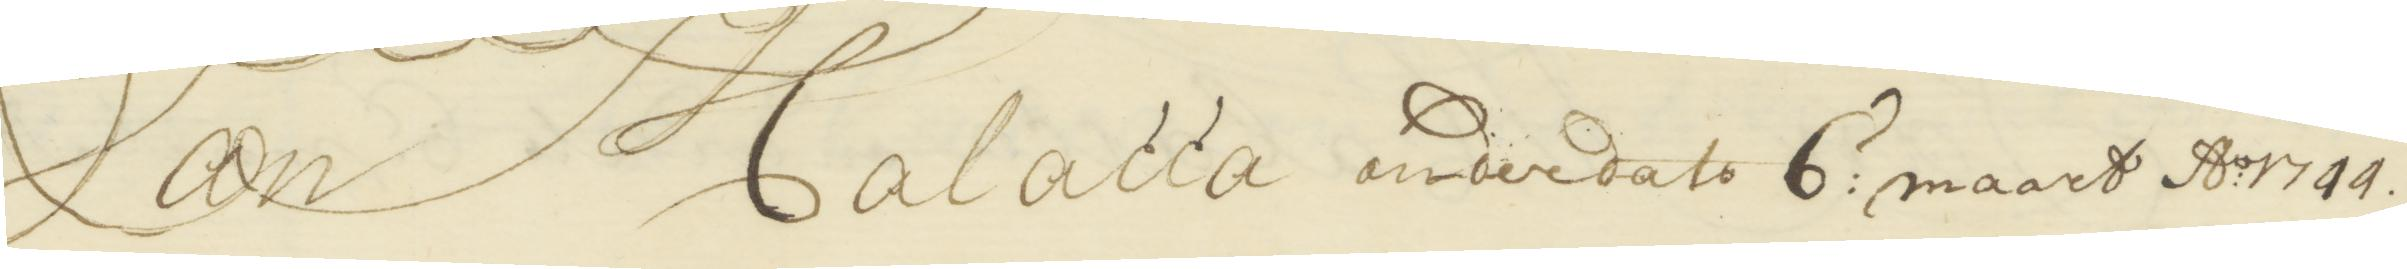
Van Malacca onder dato 6:' maart A:o 1744.
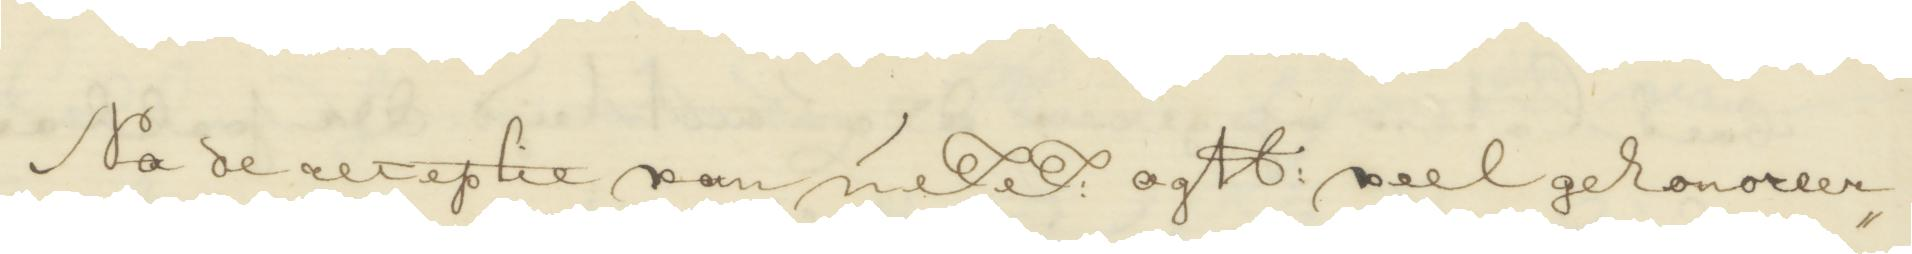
Na de receptie van u E E: agtb: veel gehonoreer„
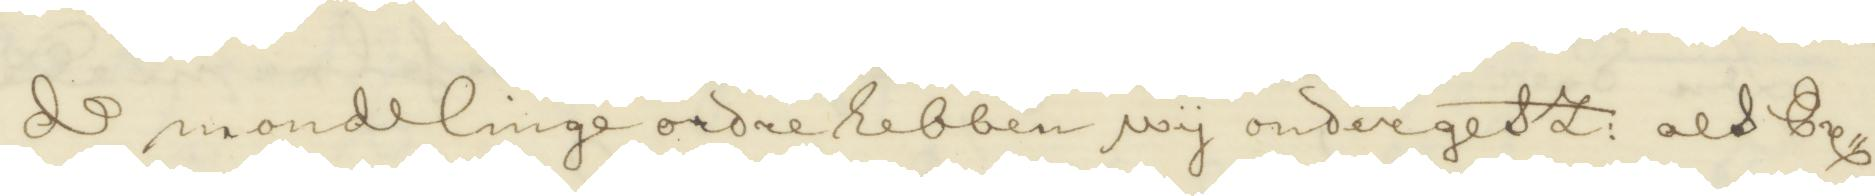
de mondelinge ordre hebben wij ondergesz: als Ex„
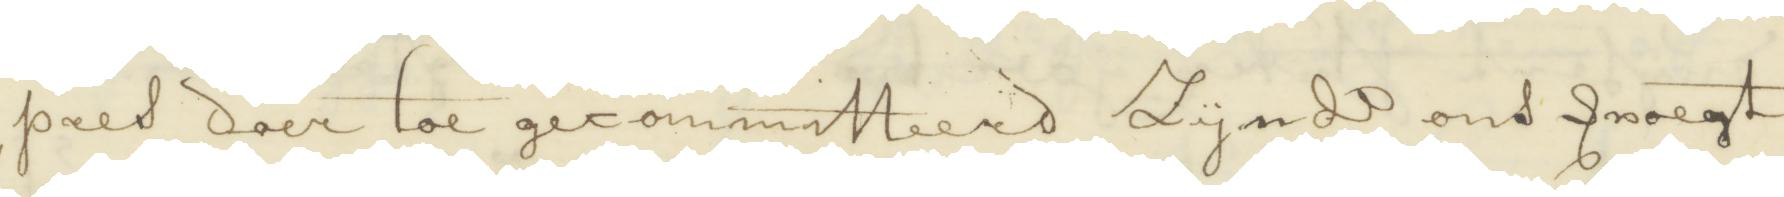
pres daer toe gecommitteerd zijnde, ons vervoegt
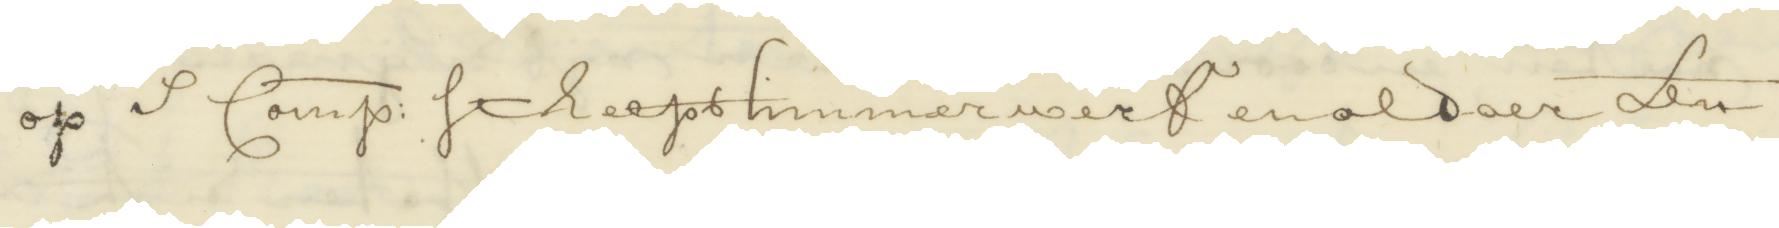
op ’s Comp: scheeps timmerwerf en aldaer, ten
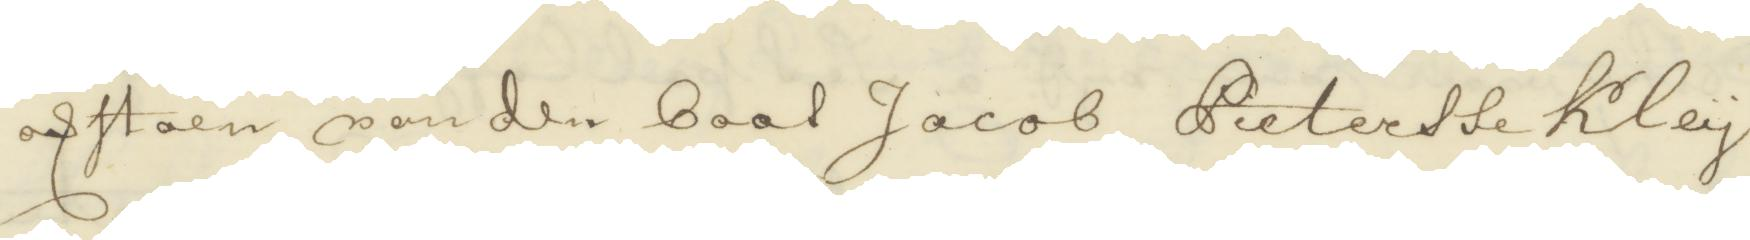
overstaen van den baas Jacob Pietersse Kleij
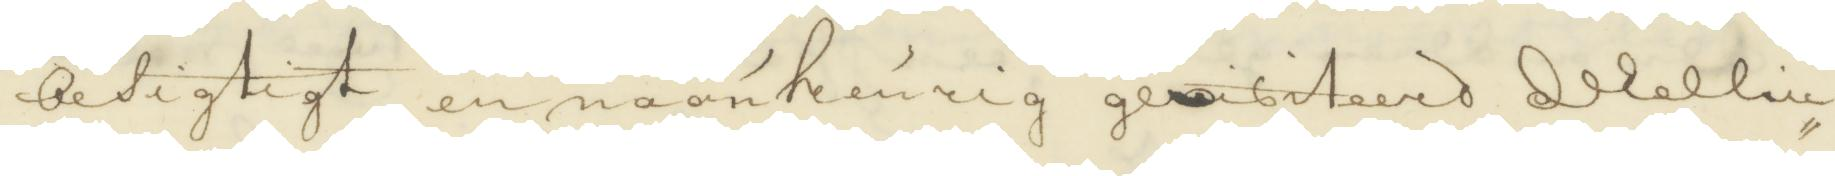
besigtigt, en naaukeurig gevisiteerd, de hellin„
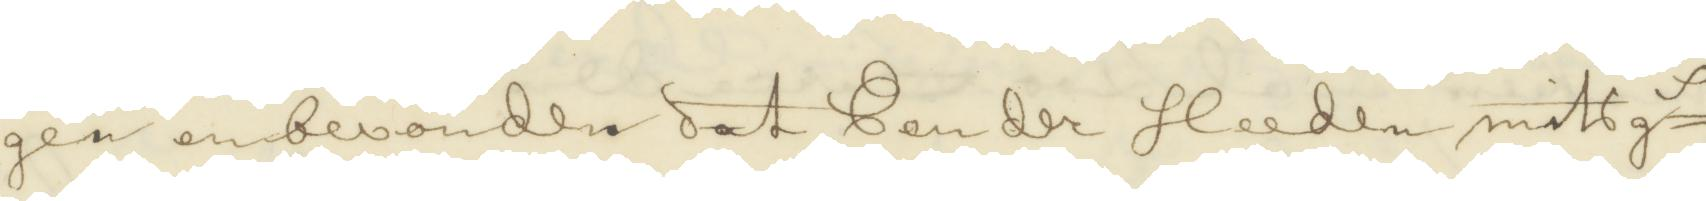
gen, en bevonden dat Een der sleeden mitsg=s
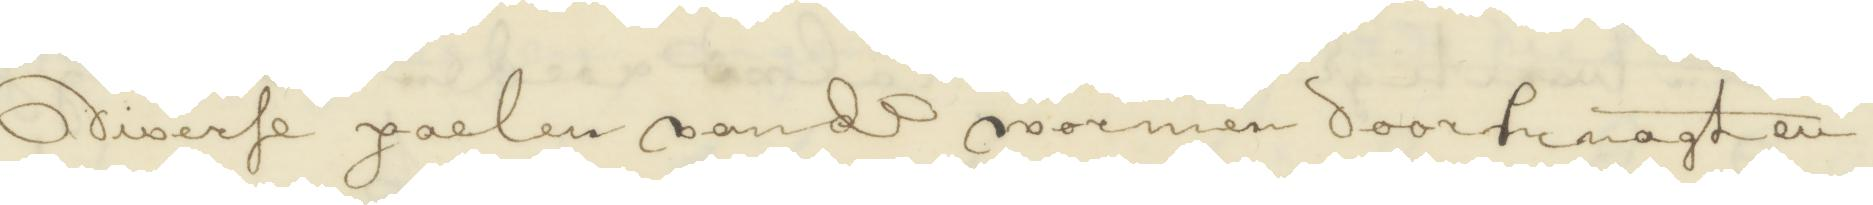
diverse paelen van de wormen doorknagt, en
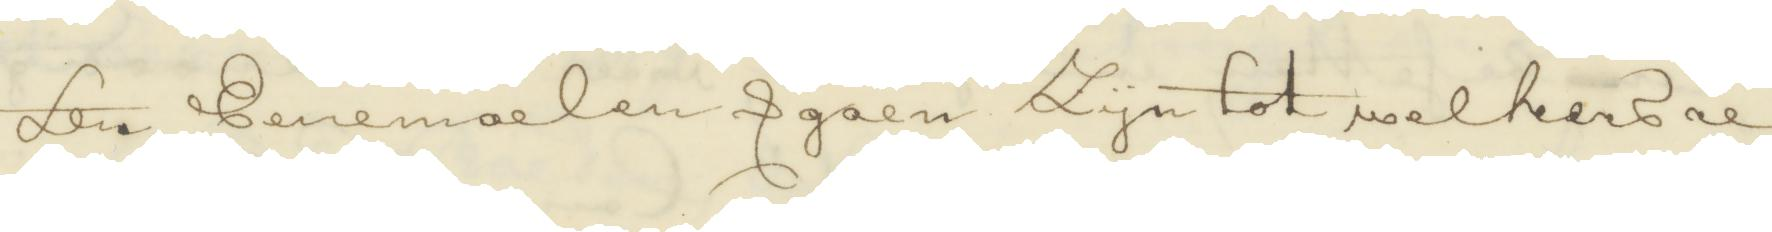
ten Eenemaelen vergaen zijn tot welkers re
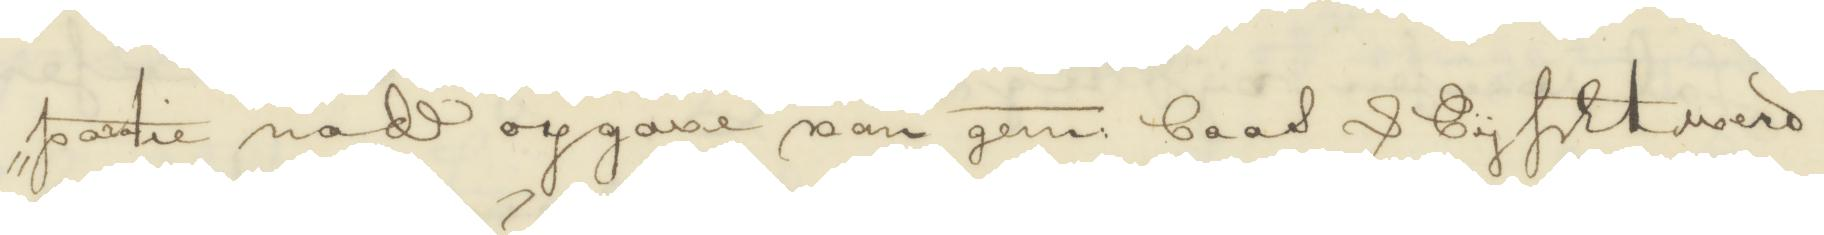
„paratie na de opgave van gem: baas verEijscht werd
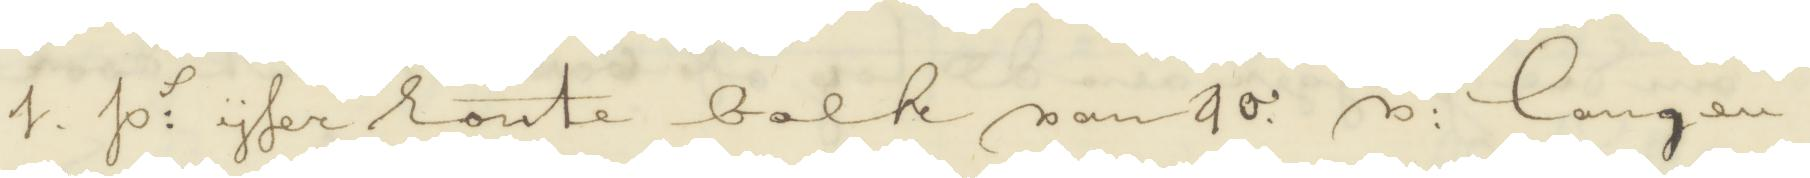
1. p:s ijser houte balk van 40: v:t langen
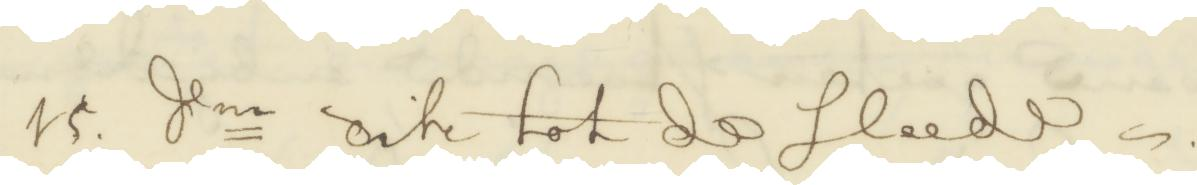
15. d=m dik tot de sleede,
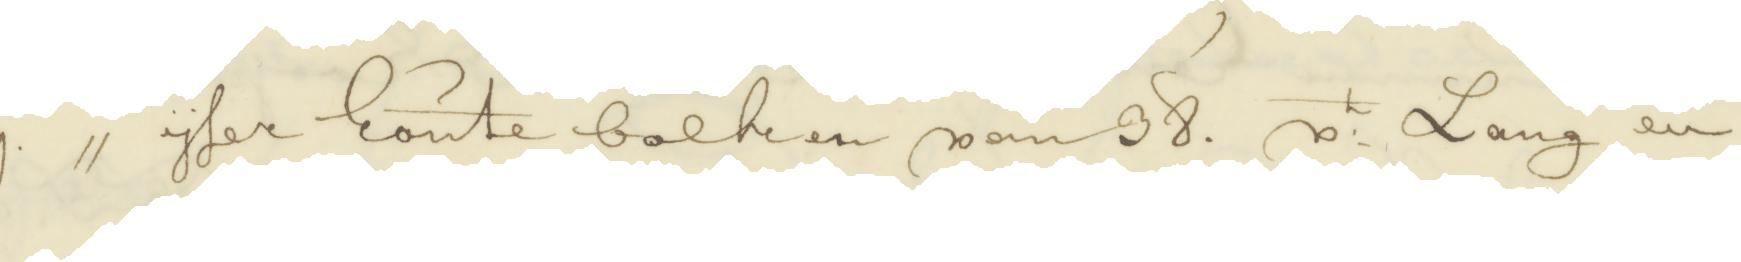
. „ ijser houte balken van 38. v:t lang, en
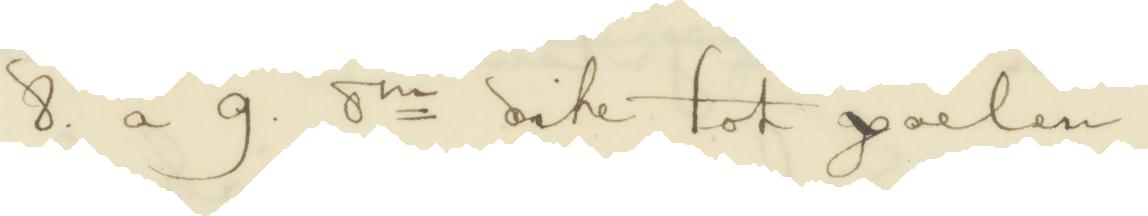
8. â 9. d=m dik, tot paelen
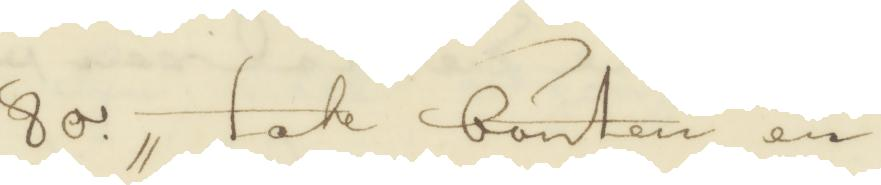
80. „ tak bouten, en
